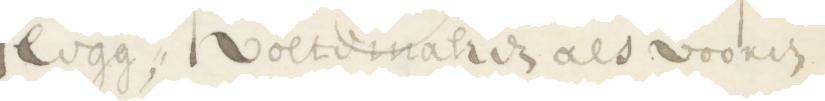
legg„s voltemaken als vooren
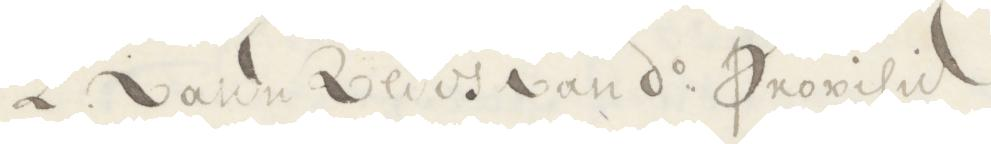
2. vaten vlees van d„o Provisie
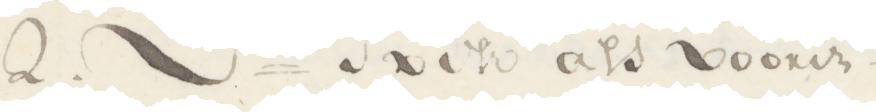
2. D=os spek als vooren
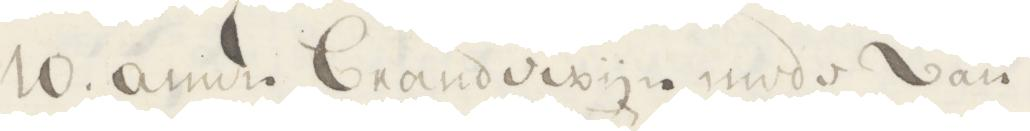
10. amen brandewijn mede van
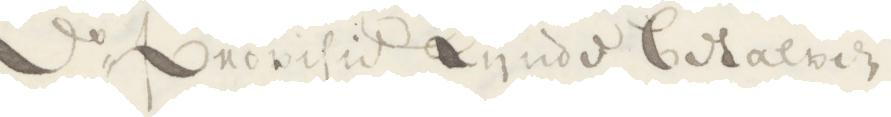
D=o Provisie zijnde behalven
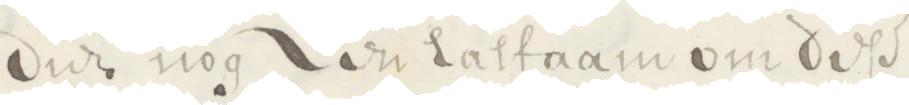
dien nog een halfaam om dese
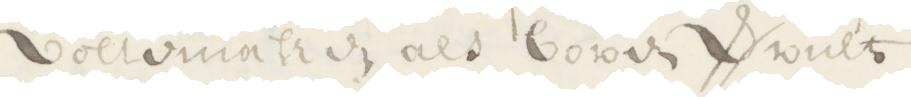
voltemaken als boven vervult
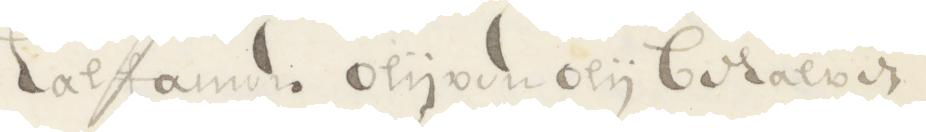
halfamen olijven olij behalven
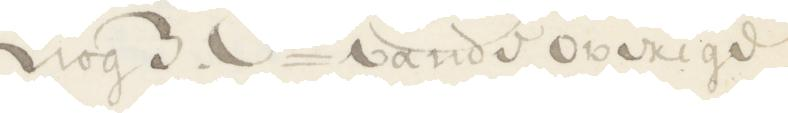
nog 3 . D=os vande overige
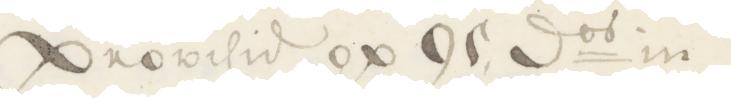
Provisie op 95. D=os in
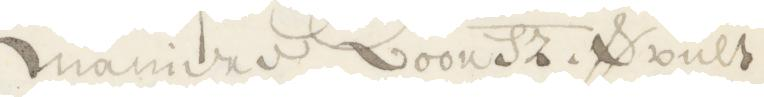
maniere voorsz. vervult
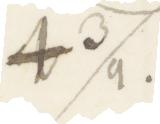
4¾.
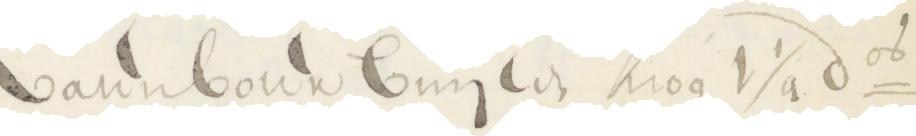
vaten boter buijten nog 1¼ d=os
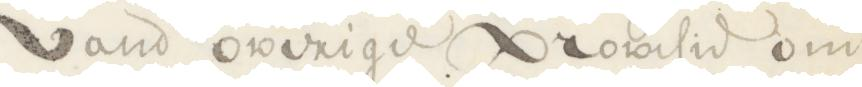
vand' overige provisie om
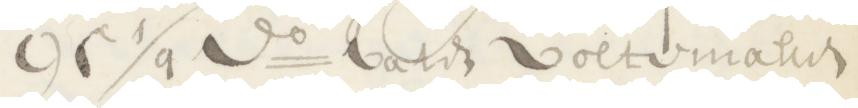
95¼ D=o vaten voltemaken
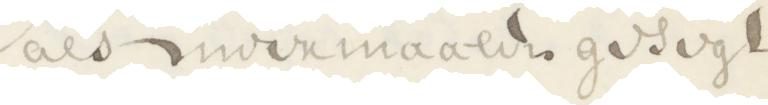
als meermaalen gesegt
